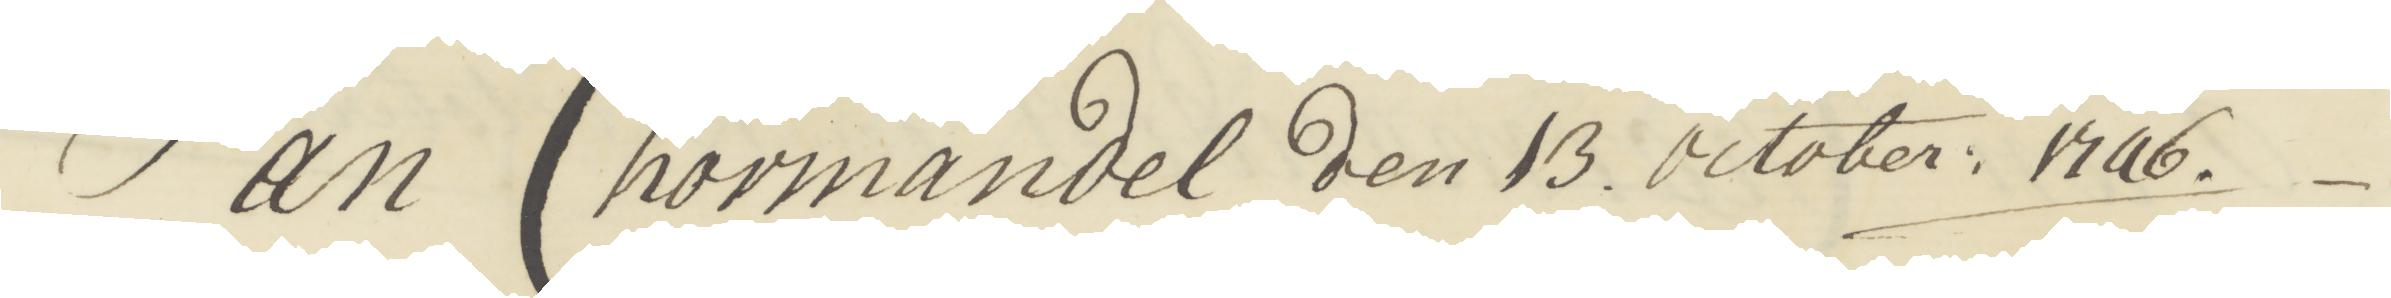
Van Chormandel den 13. october: 1746. —
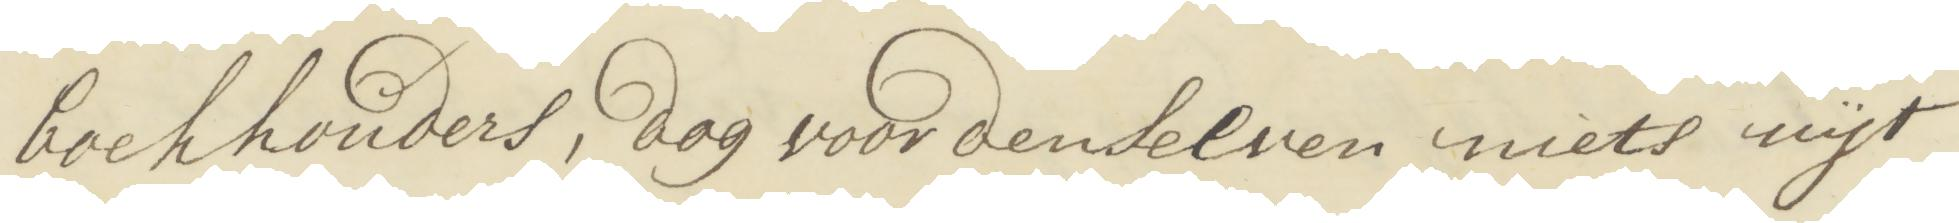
boekhouders, dog voor denselven niets uijt
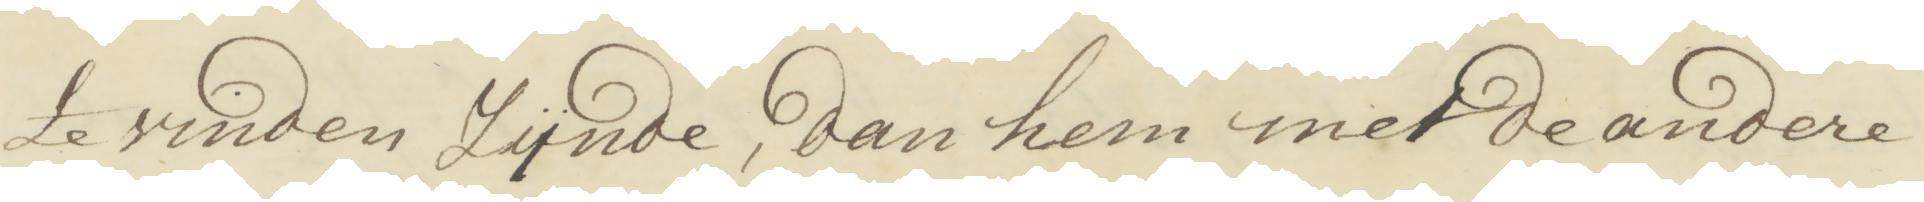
te vinden zijnde, dan hem met de andere
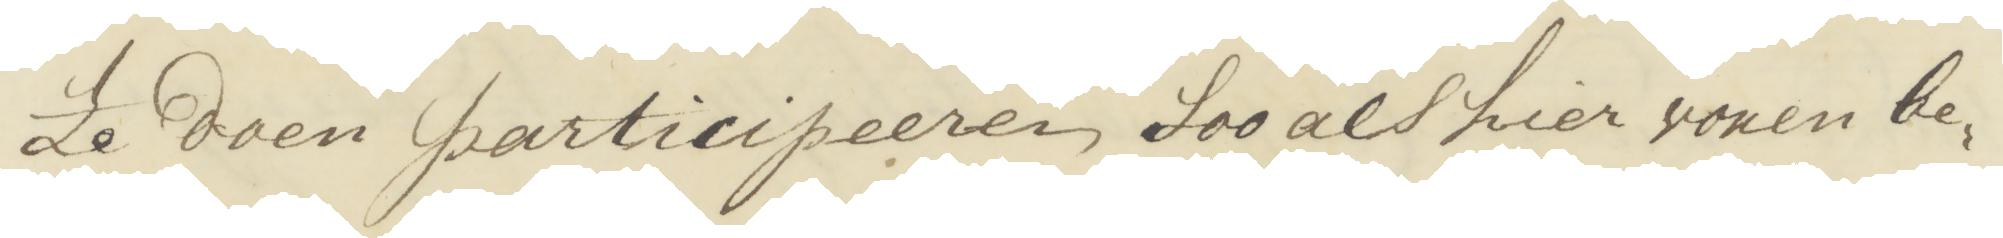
te doen participeeren soo als hier voren be„
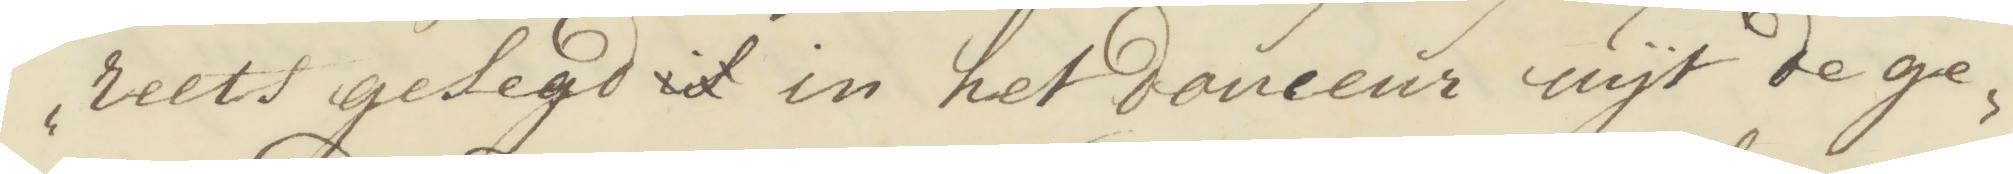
„reets gesegd is in het douceur uijt de ge„
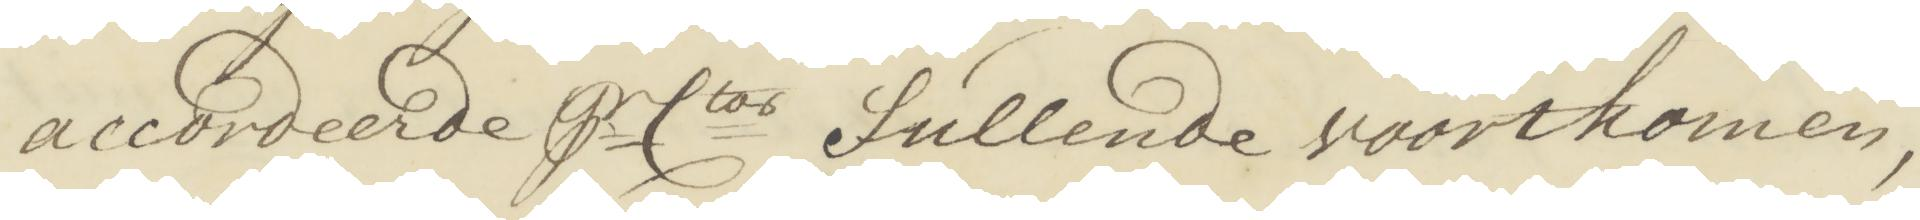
accordeerde p=r C=tos sullende voortkomen,
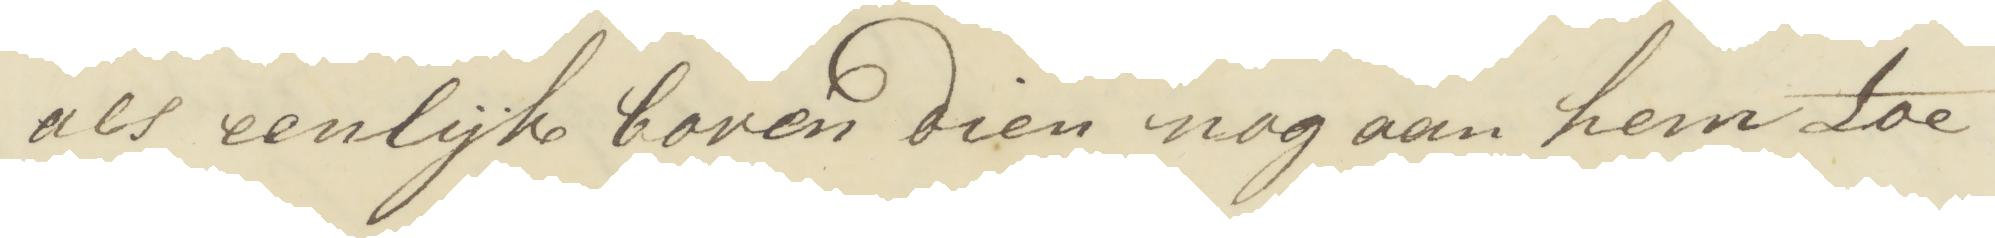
als eenlijk boven dien nog aan hem toe
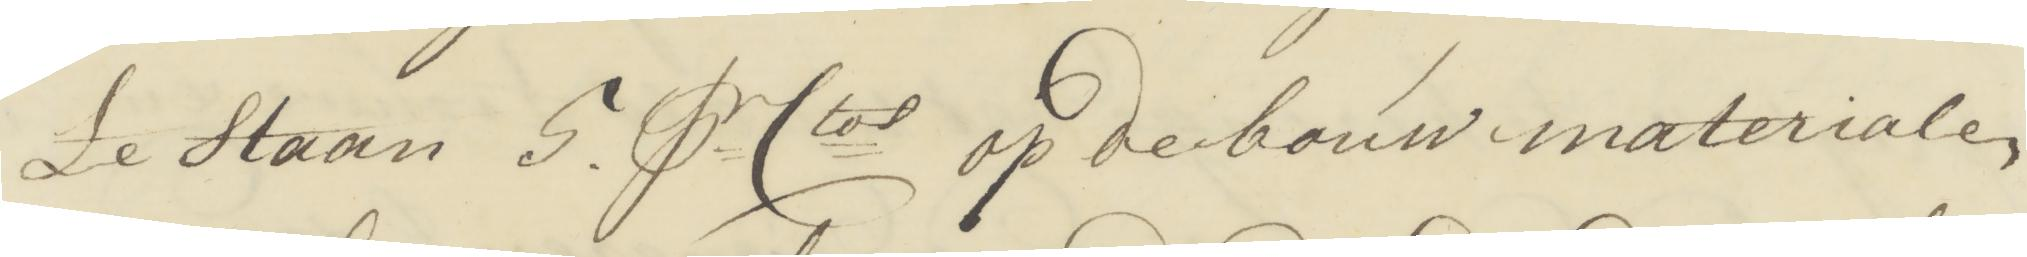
te staan 5. p=r C=tos op de bouw materialen
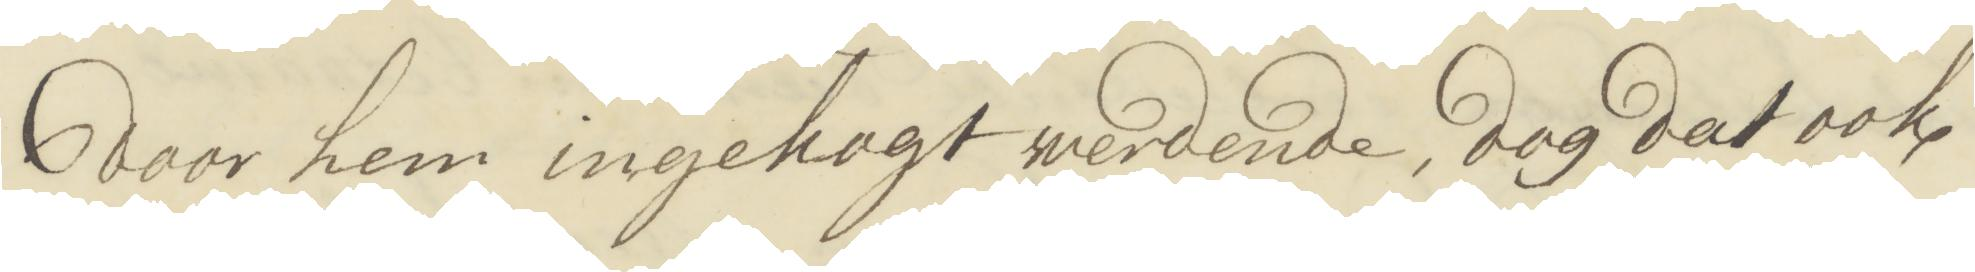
door hem ingekogt werdende, dog dat ook
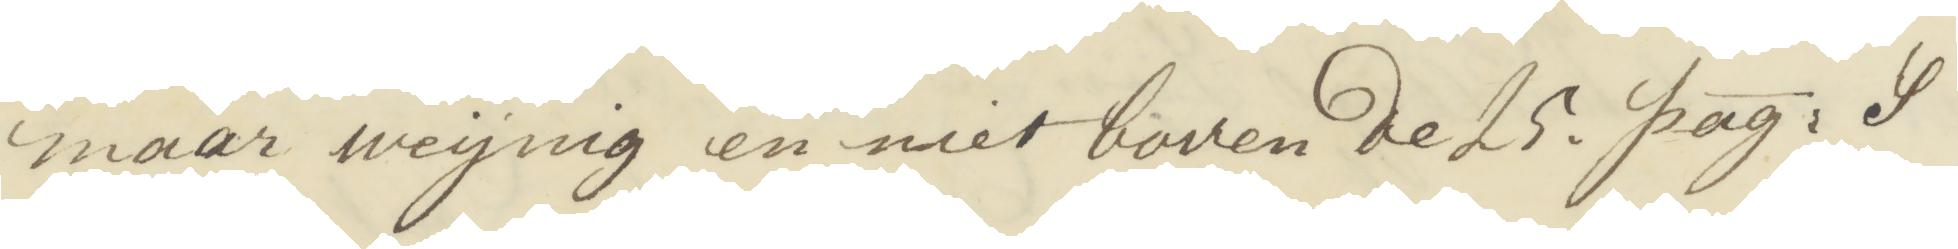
maar weijnig en niet boven de 25. pag: 's
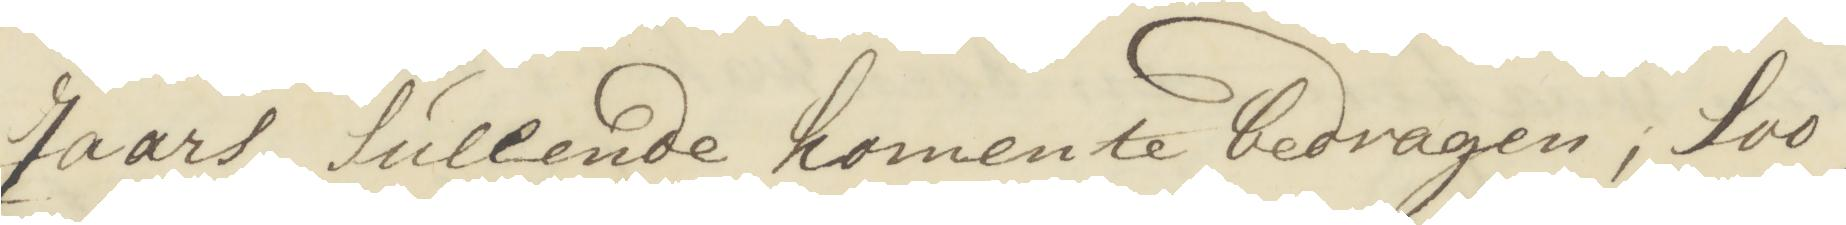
Jaars sullende komen te bedragen; soo
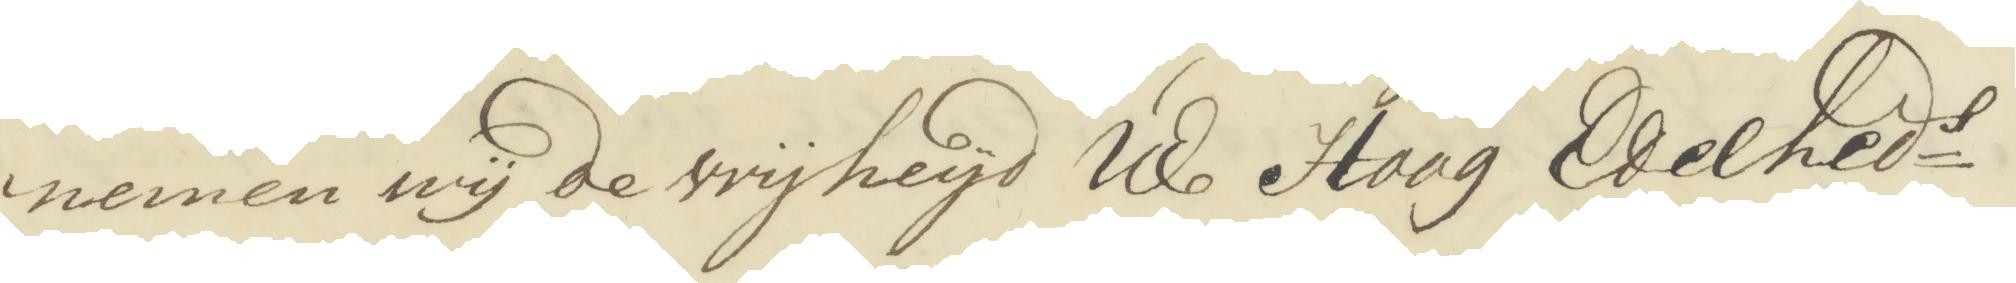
nemen wij de vrijheijd UE Hoog Edelhed=s
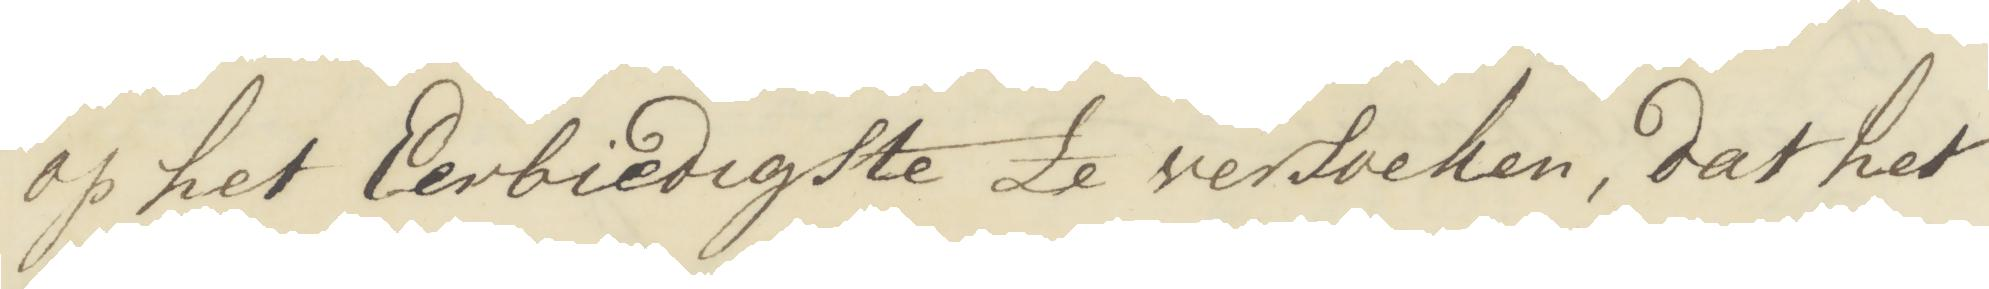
op het Eerbiedigste te versoeken, dat het
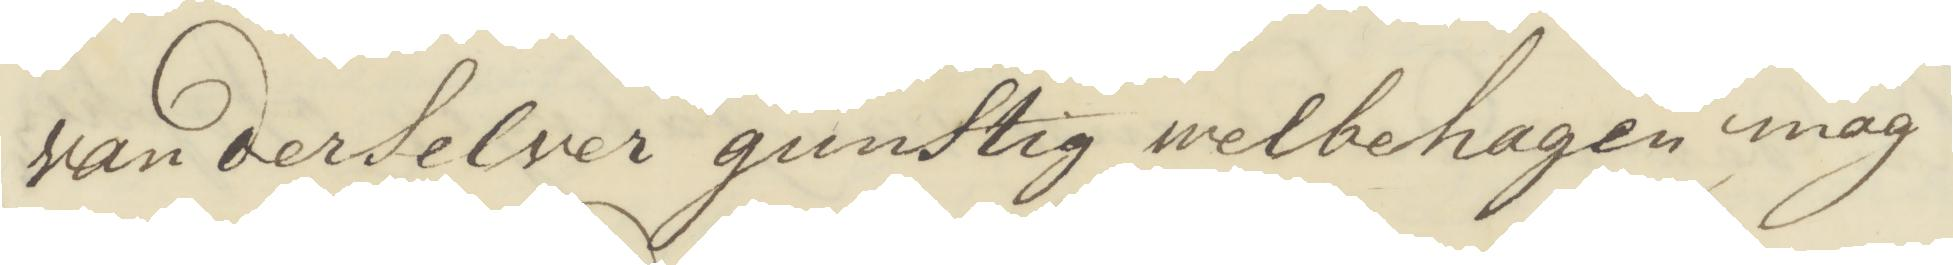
van derselver gunstig welbehagen mag
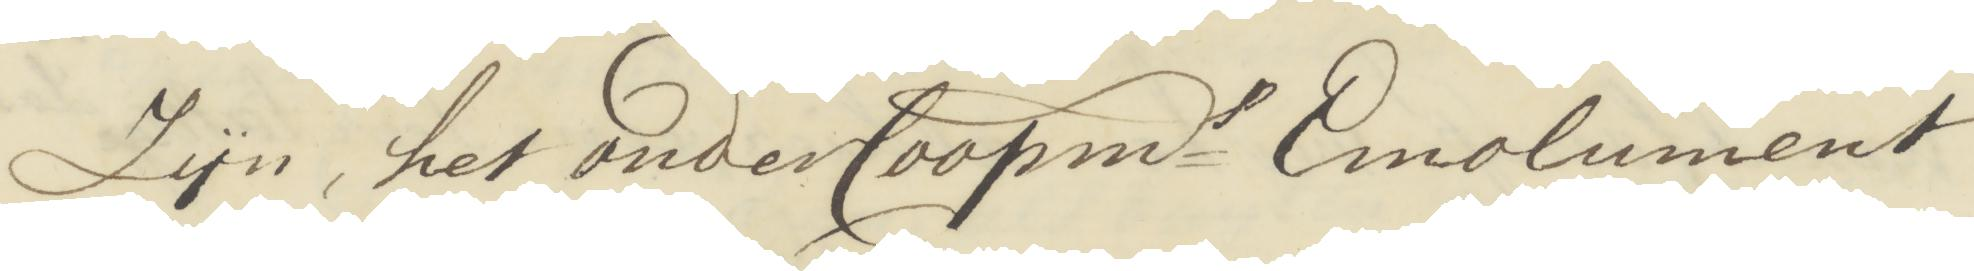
zijn, het ondercoopm=s Emolument
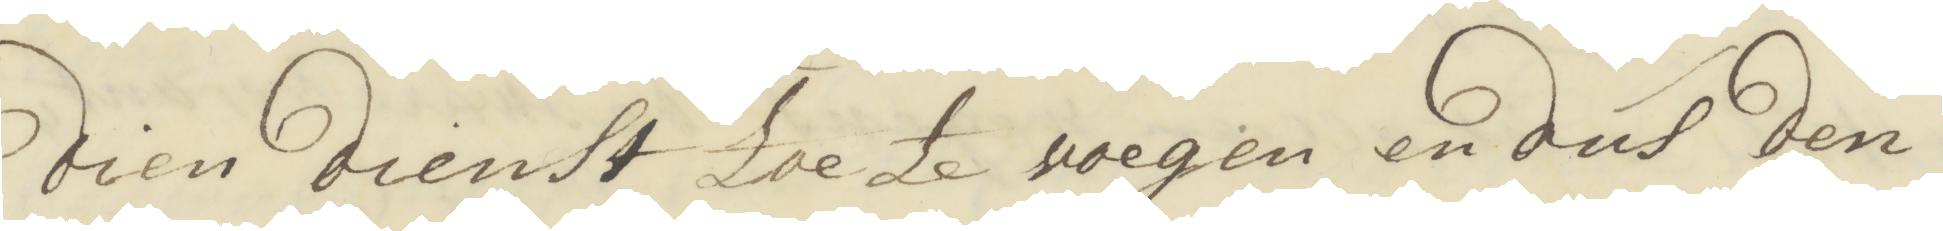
dien dienst toe te voegen en dus den
